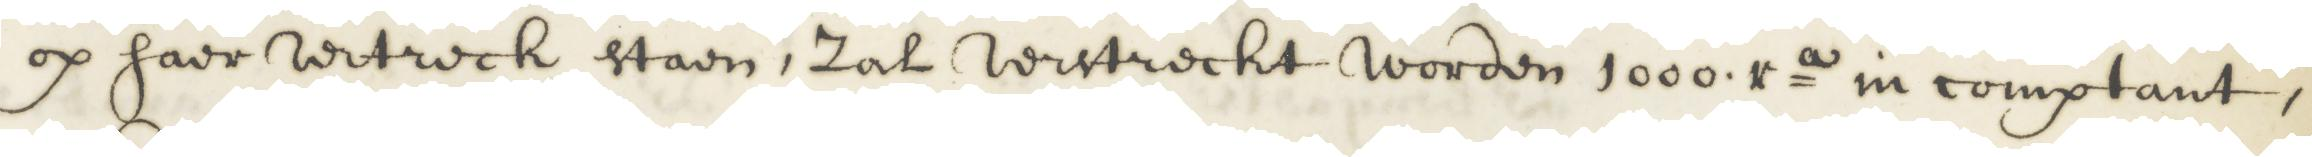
op haer vertreck staen, zal verstreckt worden 1000. r=a in comptant,
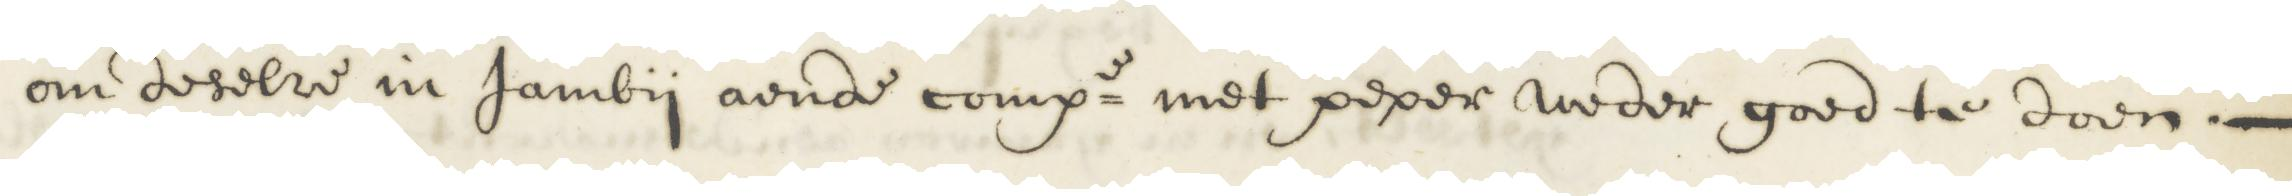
om deselve in jambij aende comp=e met peper weder goed te doen.—
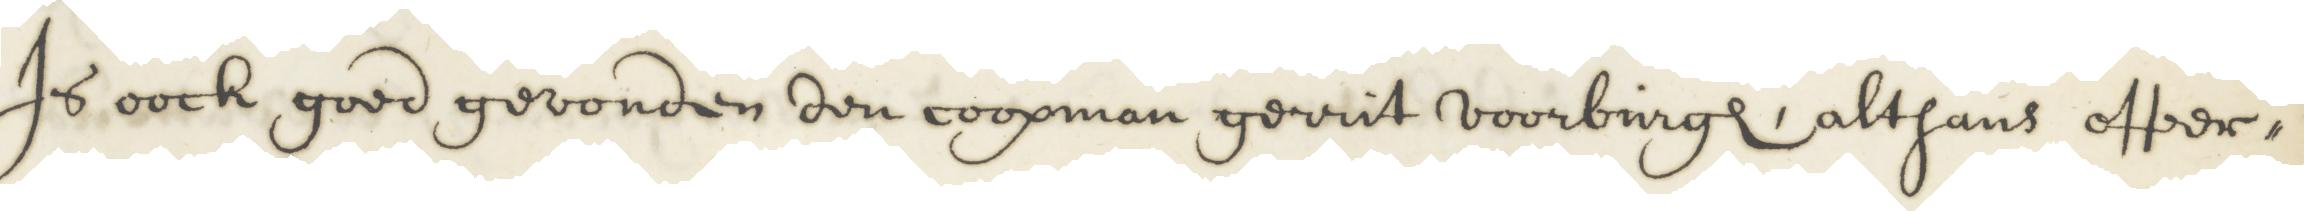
Js oock goed gevonden den coopman gerrit voorburgh, althans opper„
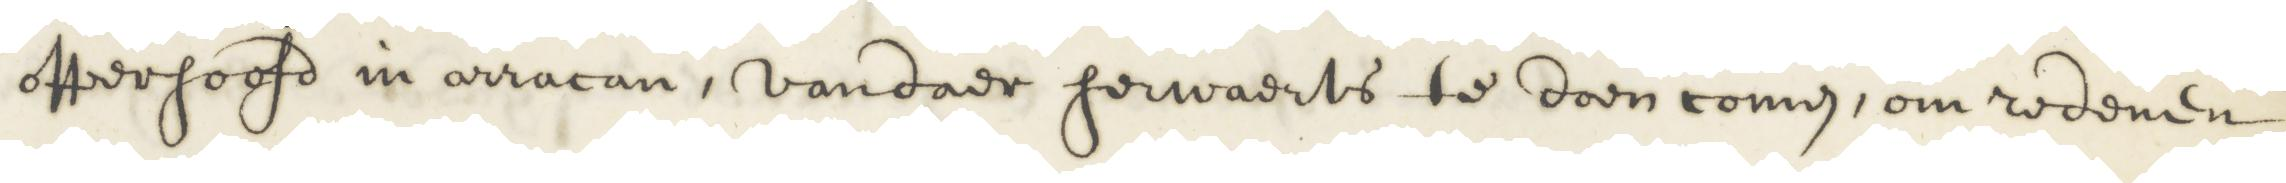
opperhoofd in arracan, vandaer herwaerts te doen comen, om redenen
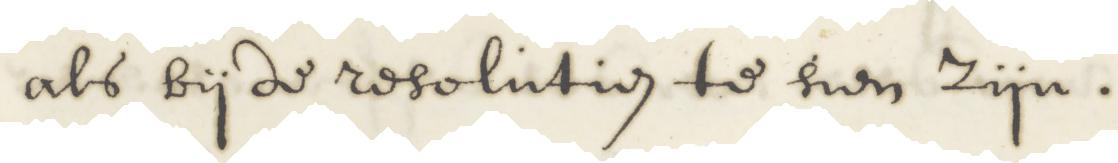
als bij de resolutien te sien zijn.
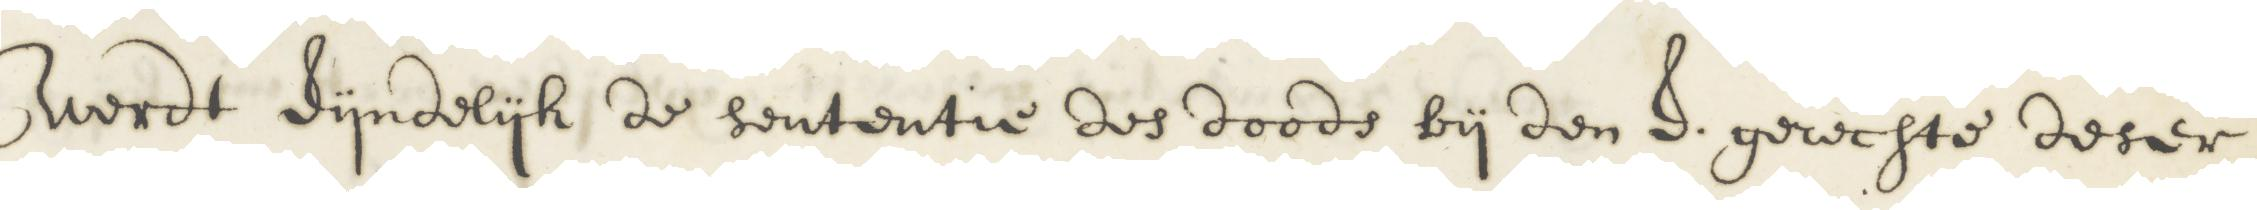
Werdt Eijndelijk de sententie des doods bij den E. gerechte deser
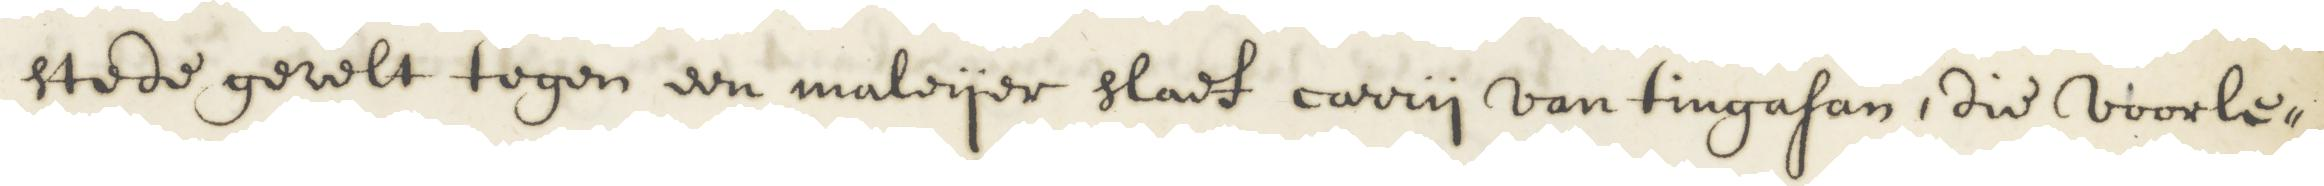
stede gevelt tegen een maleijer slaef carrij van tingahan, die voorle„
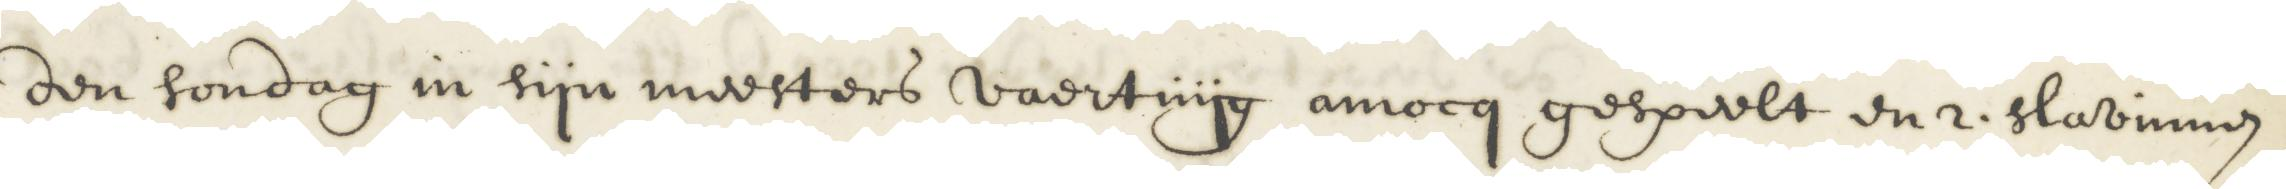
den sondag in sijn meesters vaertuijg amocq gespeelt en 2. slavinnen
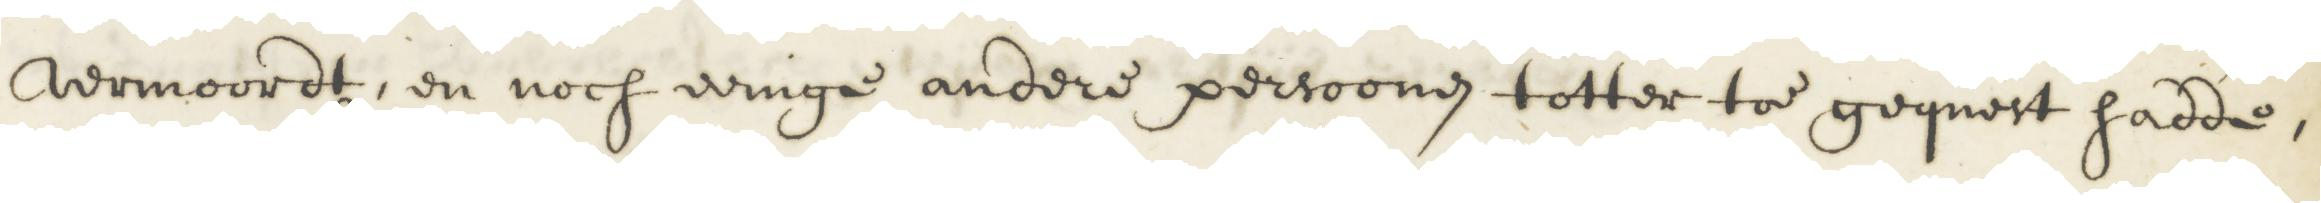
vermoordt, en noch eenige andere persoonen totter toe gequest hadde,
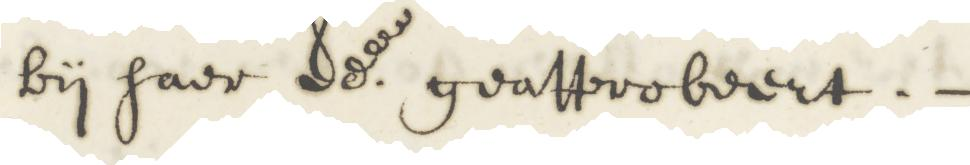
bij haer Ed:le geapprobeert. —
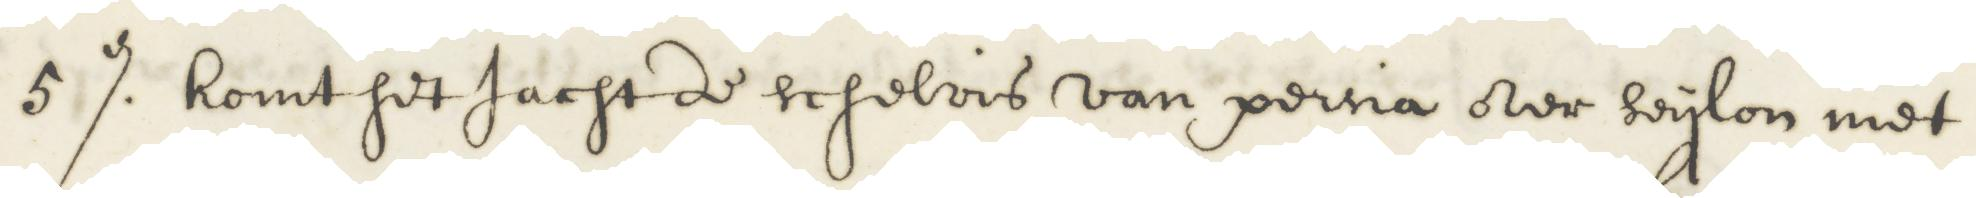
5en. komt het jacht de schelvis van persia over seijlon met
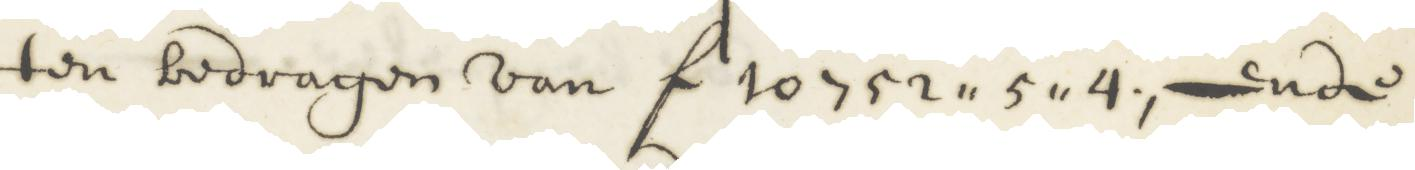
ten bedragen van ƒ 10752„ 5 „ 4., ende
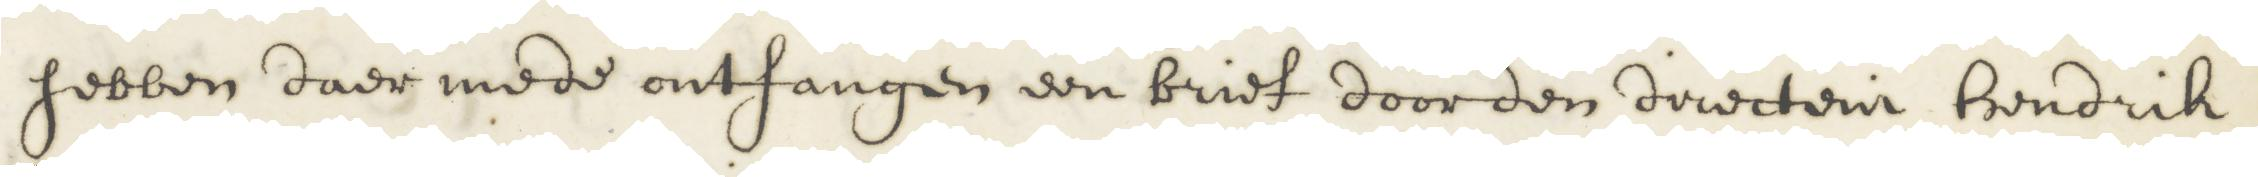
hebben daer mede ontfangen een brief door den directeur Hendrik
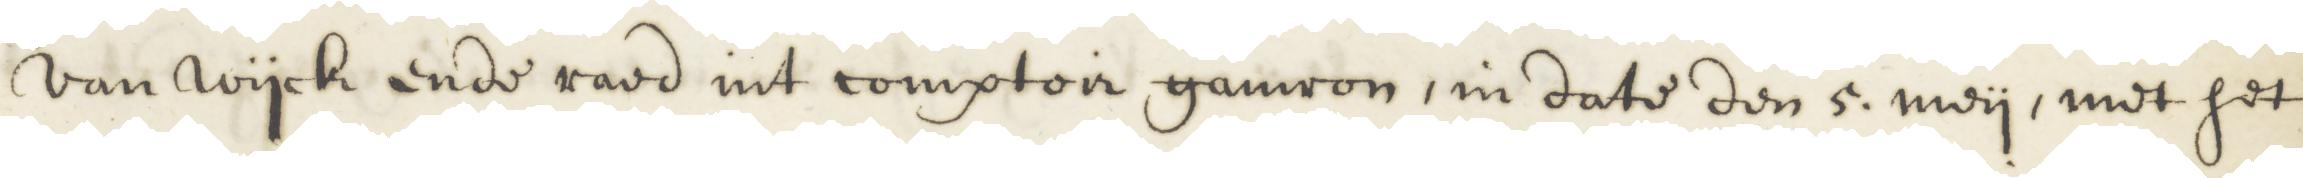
van wijk ende raed int comptoir gamron, in date den 5. meij, met het
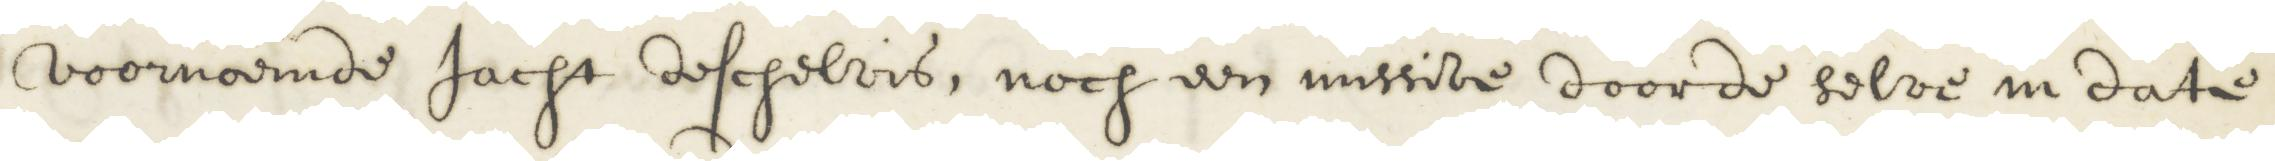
voornoemde jacht de schelvis, noch een missive door de selve in date
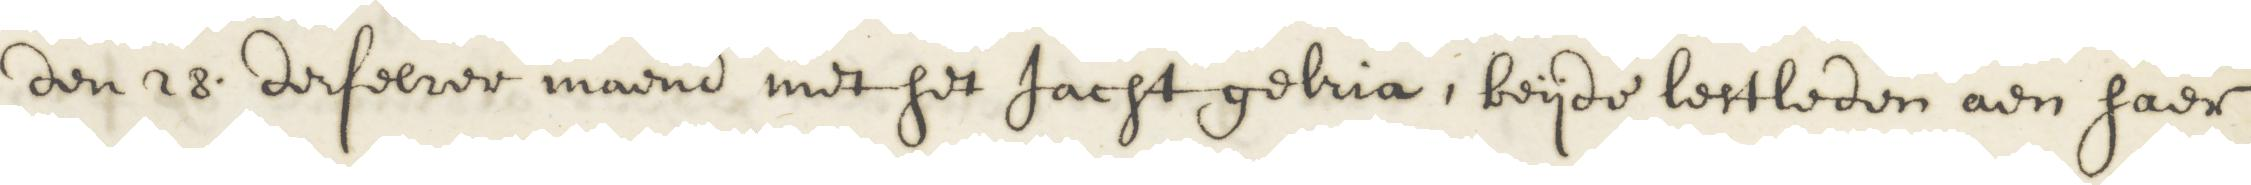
den 28. derselver maend met het Jacht gelria, beijde lestleden aen haer
